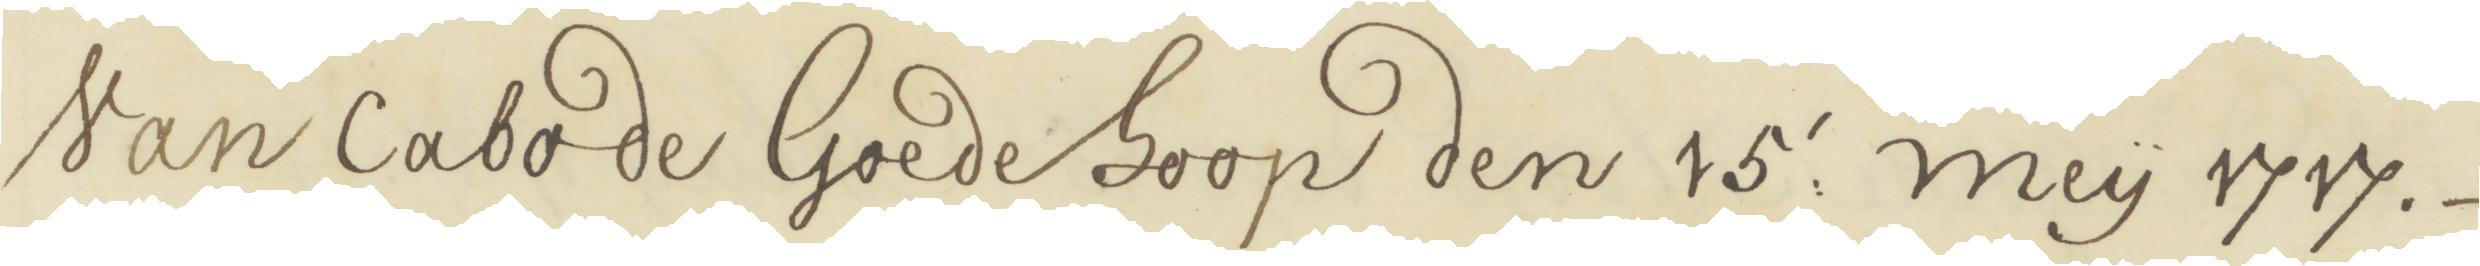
Van Cabo de Goede Hoop den 15:' meij 1717.
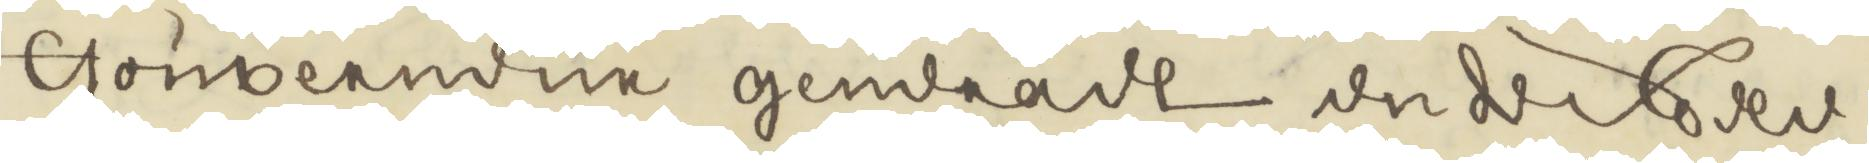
Gouverneur generael en de Edele
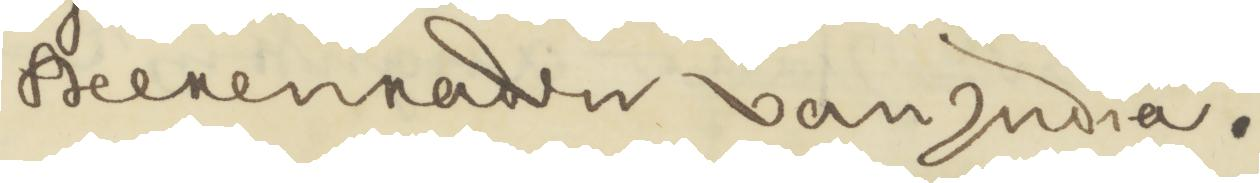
Heerenraden van Jndia.
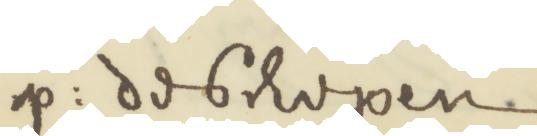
p:r de schepen
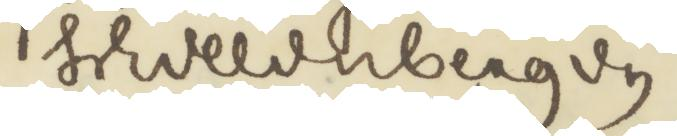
schellenbergen
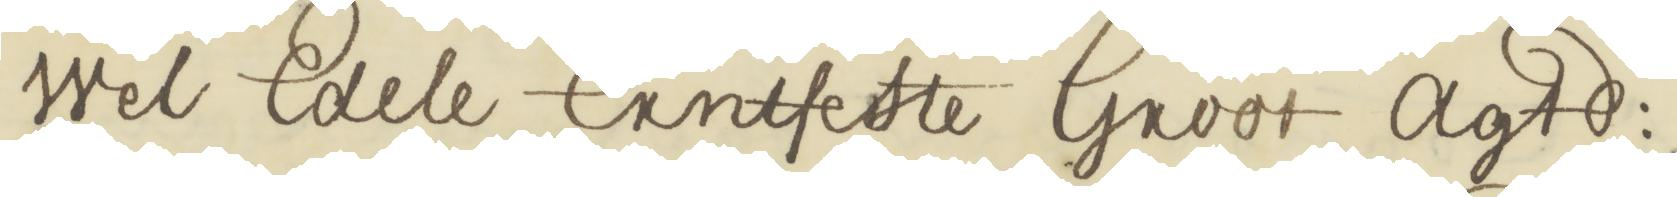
Wel Edele Erntfeste Groot Agtb:
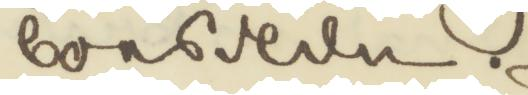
borselen.
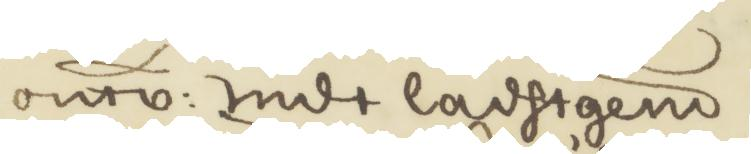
ontv: met laestgem
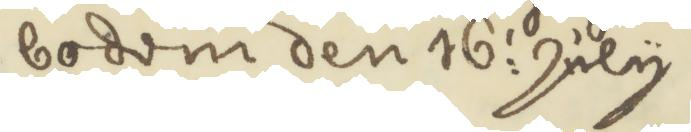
bodem den 16:' Julij
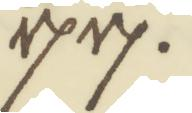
1717.
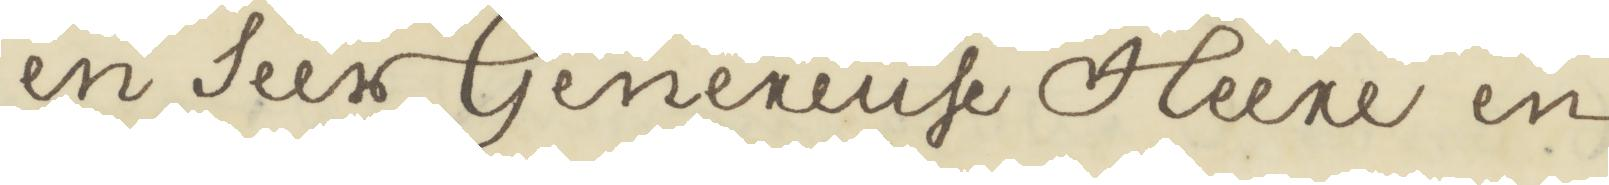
en seer Genereuse Heere en
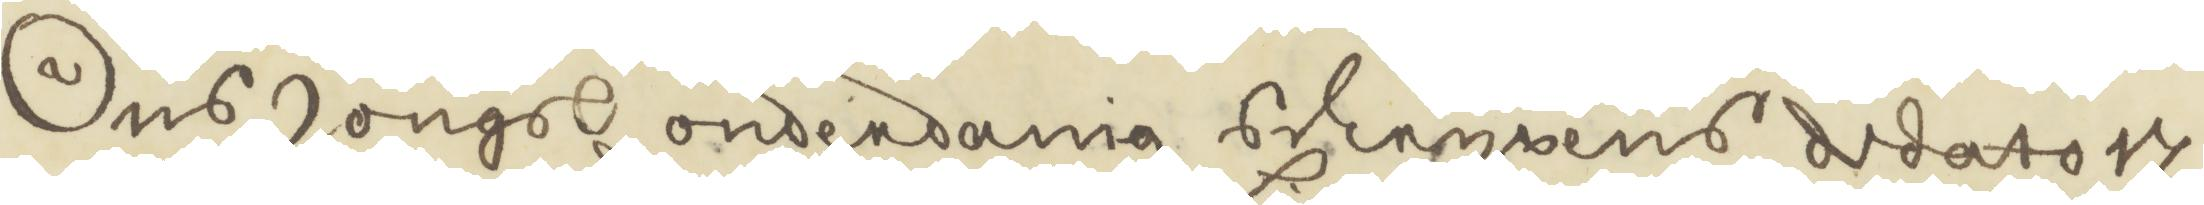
Ons Jongst onderdanig schrijvens de dato 17:'
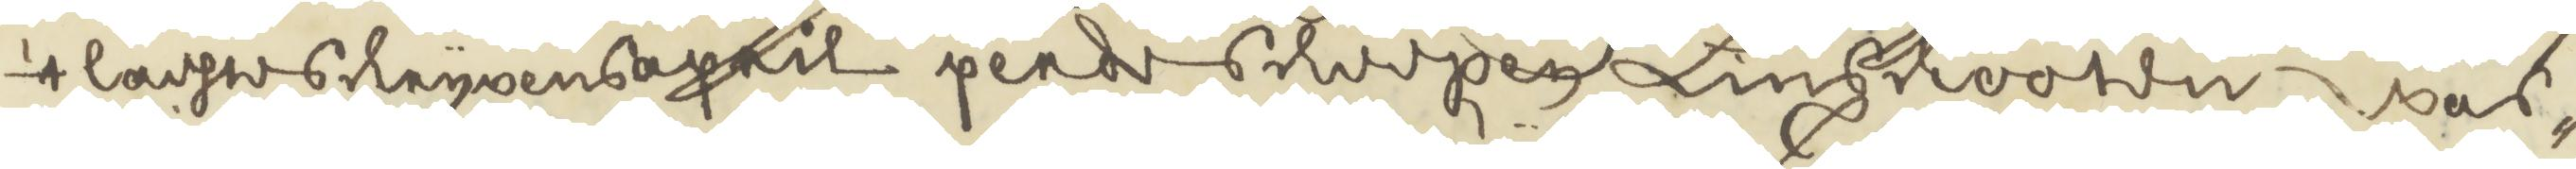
’t laeste schrijvens april per de scheepen Linschooten, was„
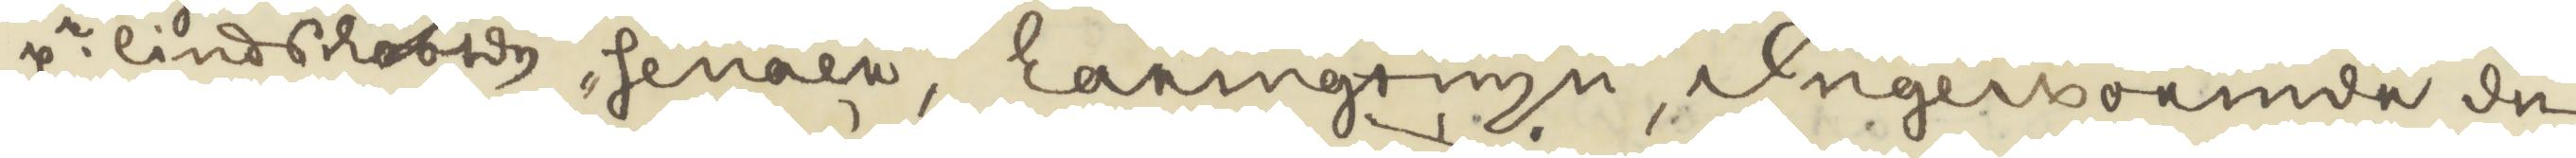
p.r lindschooten „senaer, haringtuijn, Engewormer en
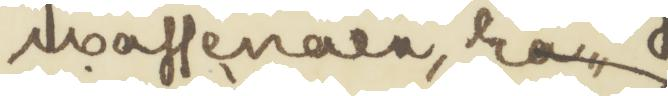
wassenaer, ha„
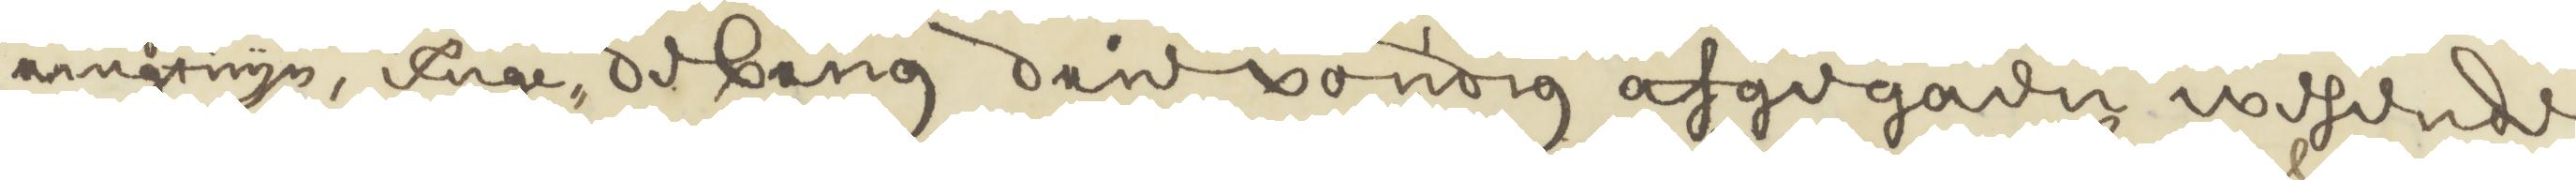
ringtuijn, Enge„ de brug drie voudig afgegaen wesende
